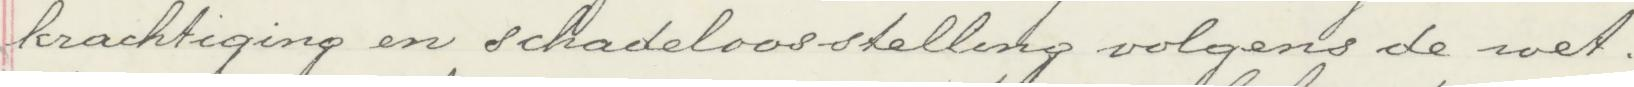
krachtiging en schadeloosstelling volgens de wet
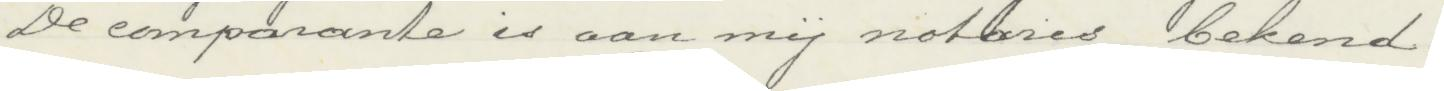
De comparante is aan mij notaris bekend
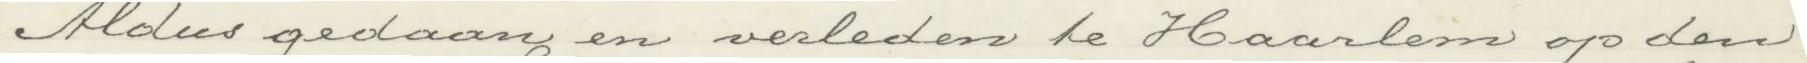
Aldus gedaan en verleden te Haarlem op den
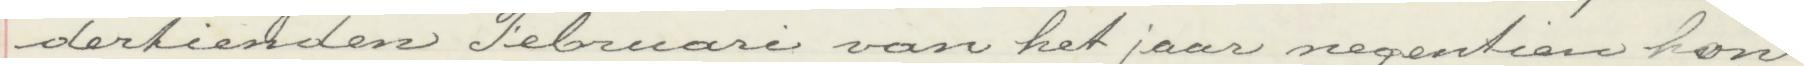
dertienden Februari van het jaar negentien hon
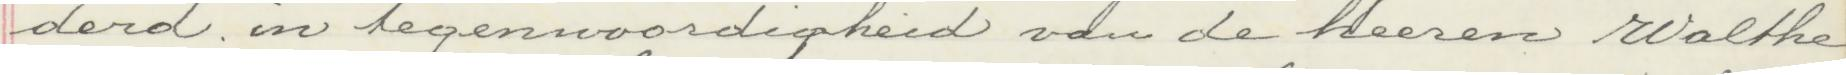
derd, in tegenwoordigheid van de heeren Walthe
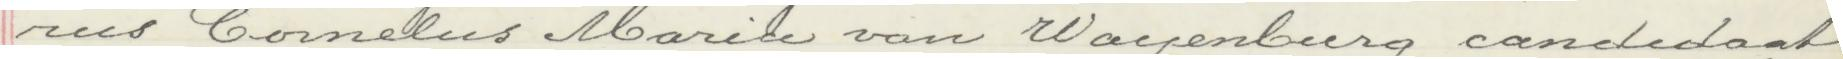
rus Cornelus Maria van Wayenburg candidaat
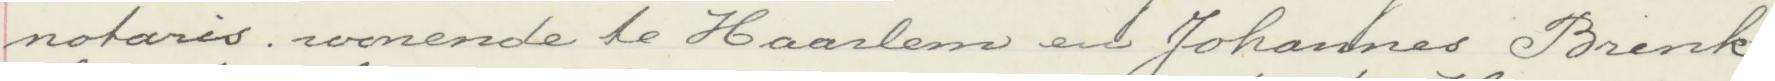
notaris, wonende te Haarlem en Johannes Brink
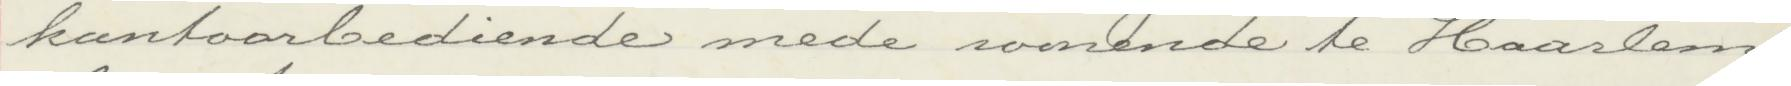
kantoorbediende mede wonende te Haarlem
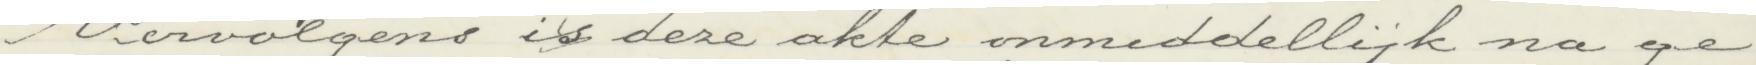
Vervolgens is deze akte onmiddellijk na ge
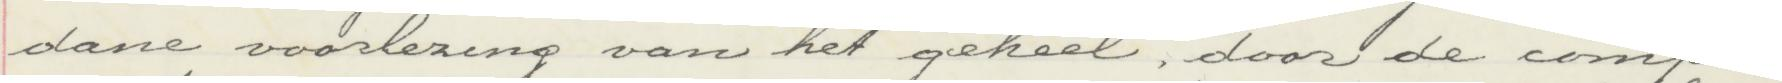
dane voorlezing van het geheel, door de compa
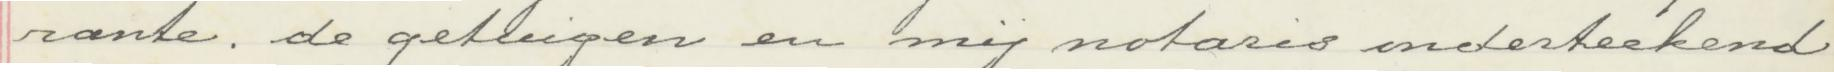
rante, de getuigen en mij notaris onderteekend
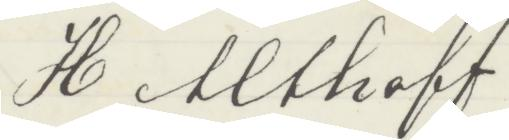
H Althoff
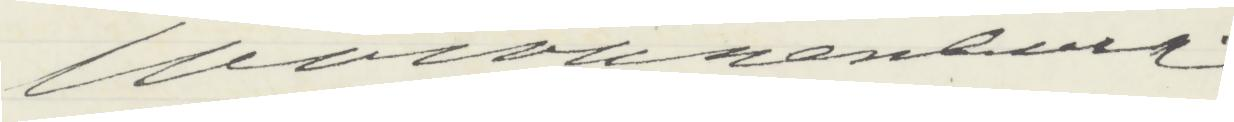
Wvwayenburg
